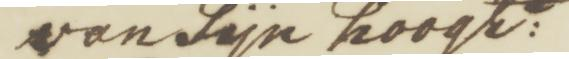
van sijn hoogh:t
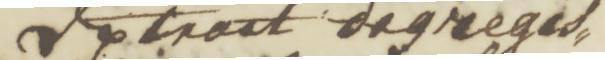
Extract dagregis„
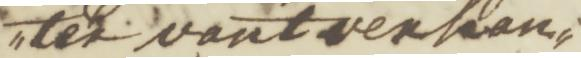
„ter van’t verhan„
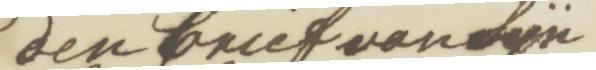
den brief van sijn
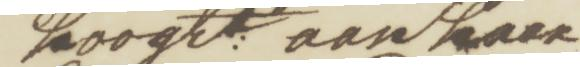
hoogh:t aan haar
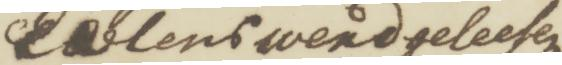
Edelens werd geleesen
